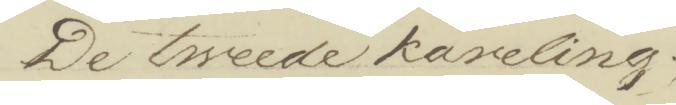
De tweede kaveling.
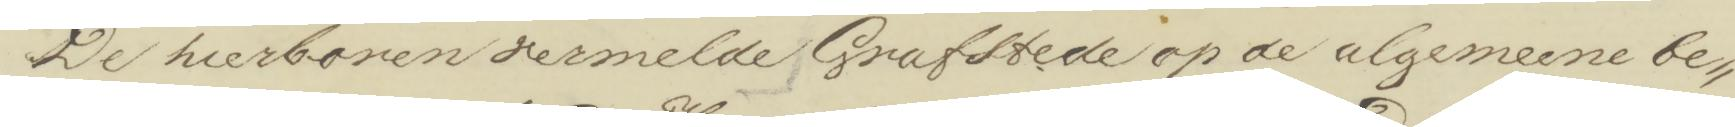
De hierboven vermelde Grafstede op de algemeene be„
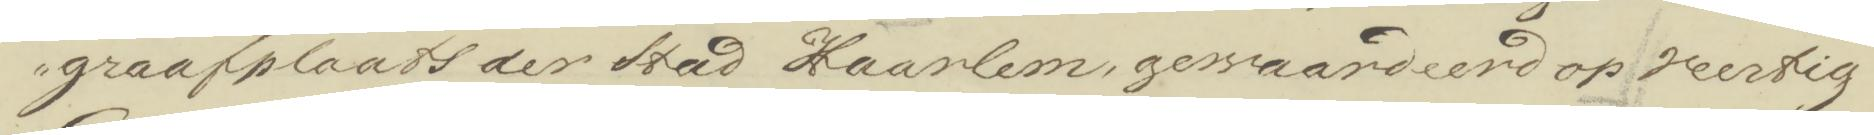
„graafplaats der stad Haarlem, gewaardeerd op veertig
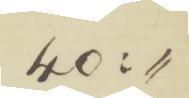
40: „
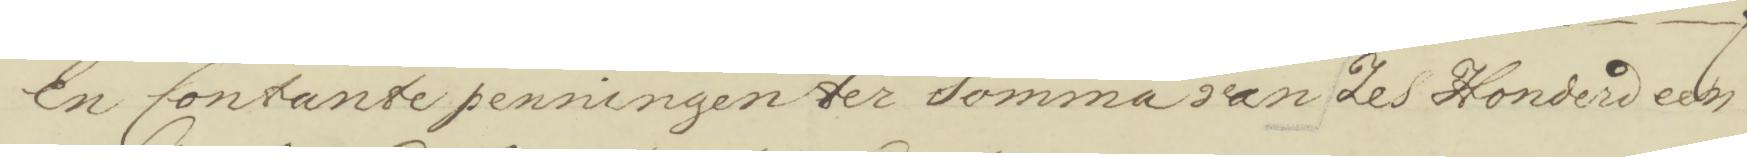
En contante penningen ter somma van Zes Honderd een
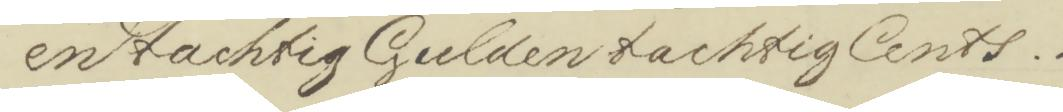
en tachtig Gulden tachtig Cents..
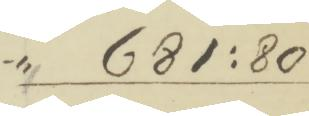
„ 681:80
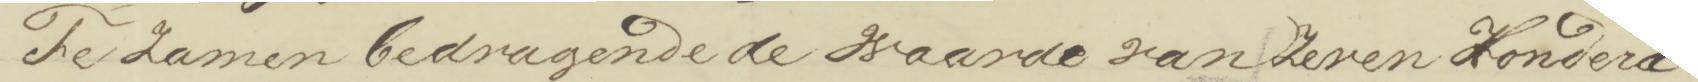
Te zamen bedragende de Waarde van Zeven Honderd
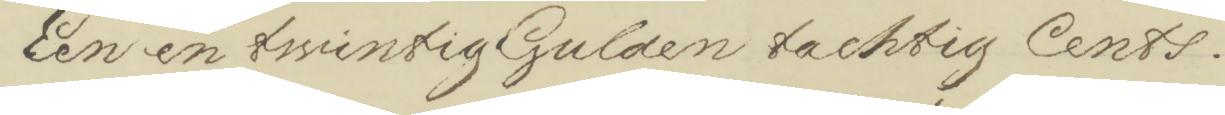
Een en twintig Gulden tachtig Cents.
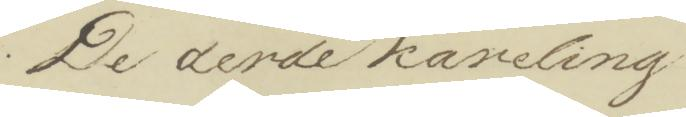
De derde kaveling
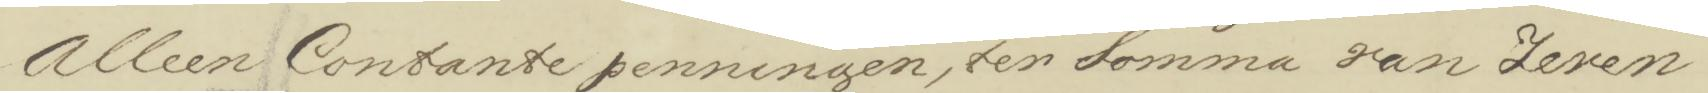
Alleen Contante penningen, ter somma van Zeven
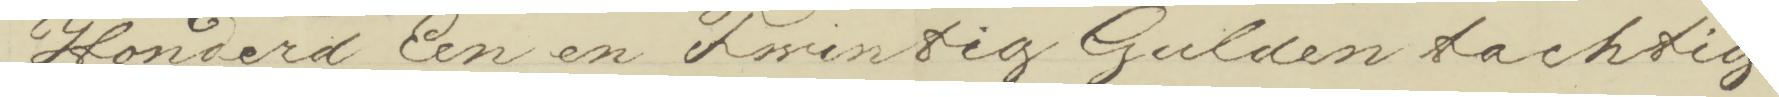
Honderd Een en Twintig Gulden tachticg
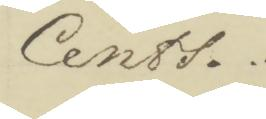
Cents..
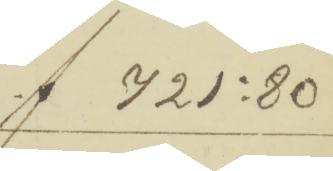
ƒ 721:80
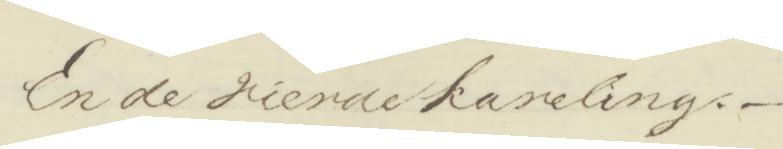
En de vierde kaveling.-
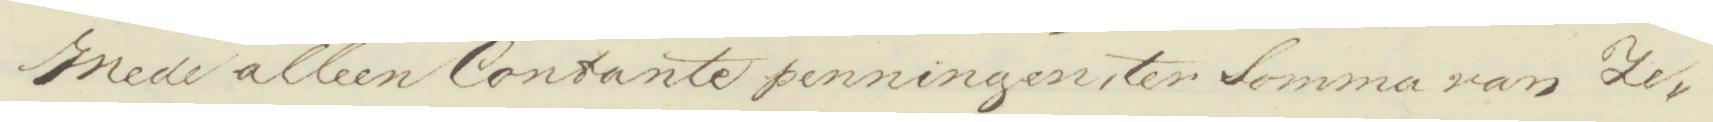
Mede alleen Contante penningen, ter somma van Ze„
